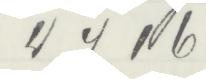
4716
